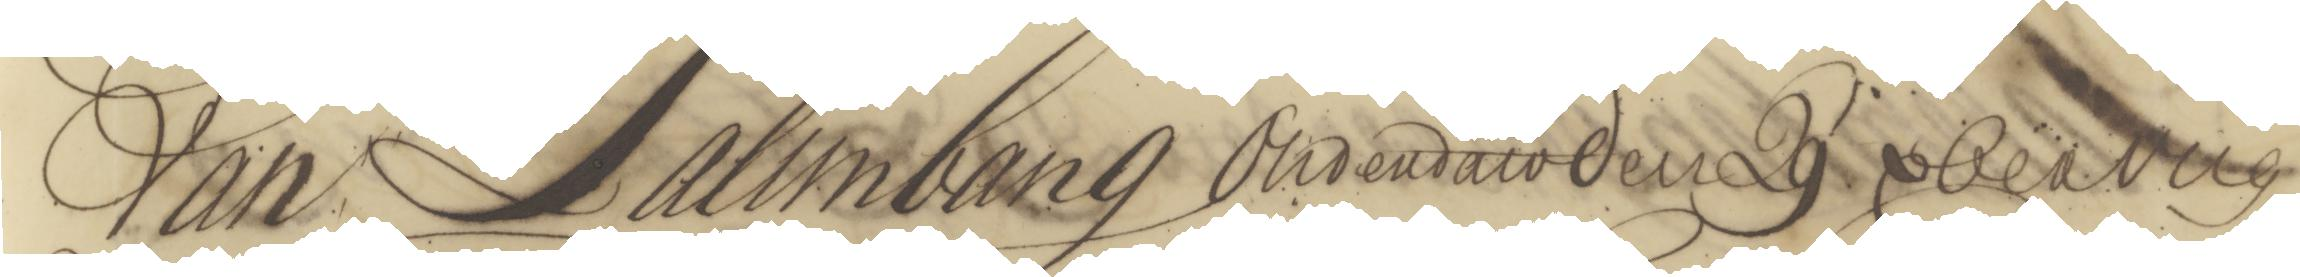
Van Palimbang onderdato den 29' xber 1719
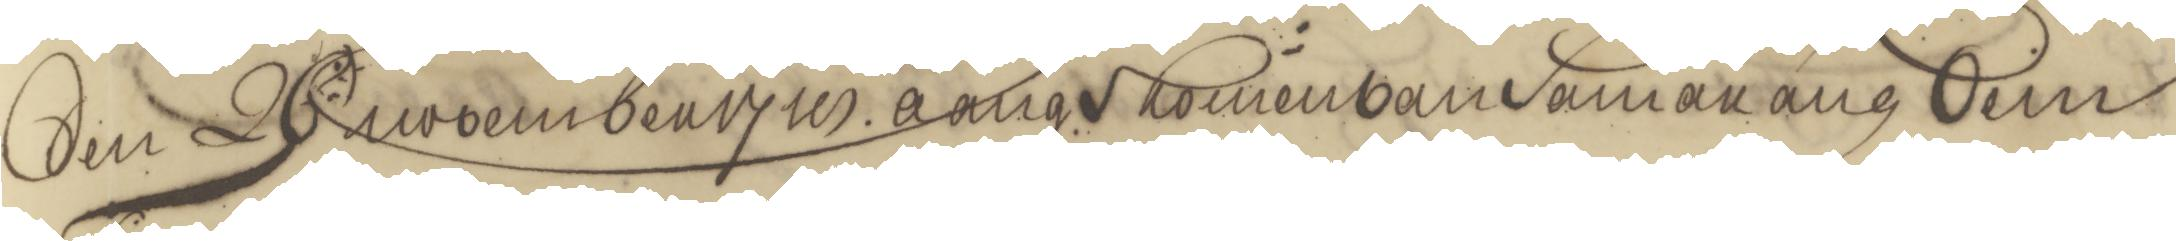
den 26' november1718. aangekomen van Samarang Oem
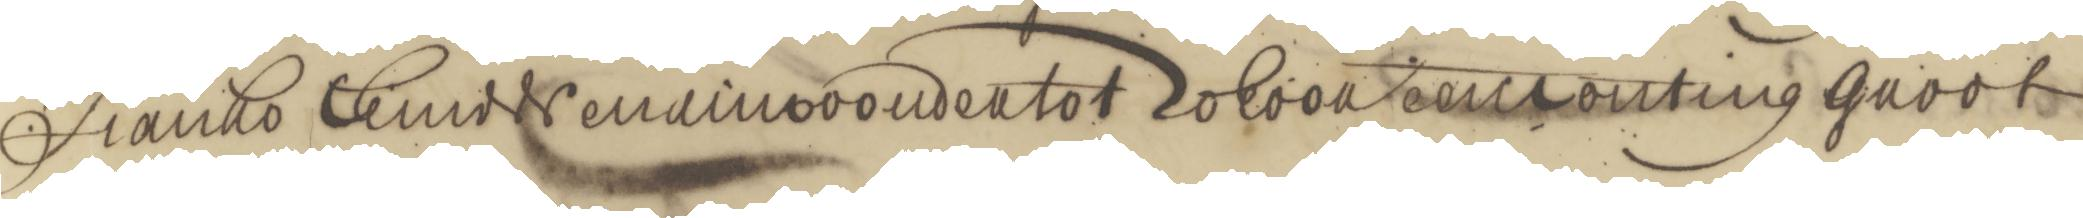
Tianko Chinees endinwoondertot Iohoor eenconting groot
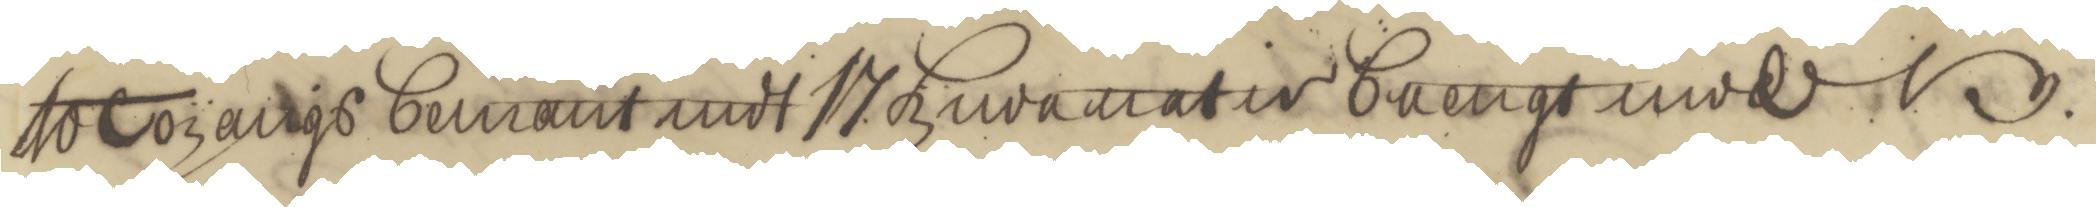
40 Coijangs bemant met 17 lijwanatie brengt mede 13.
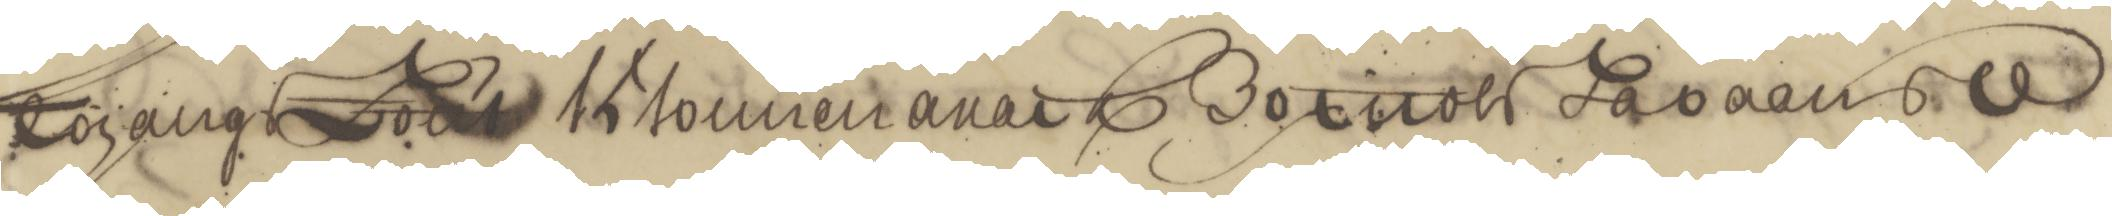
Coijang Zout 15 tonnen arack 30 picols Iavaanse
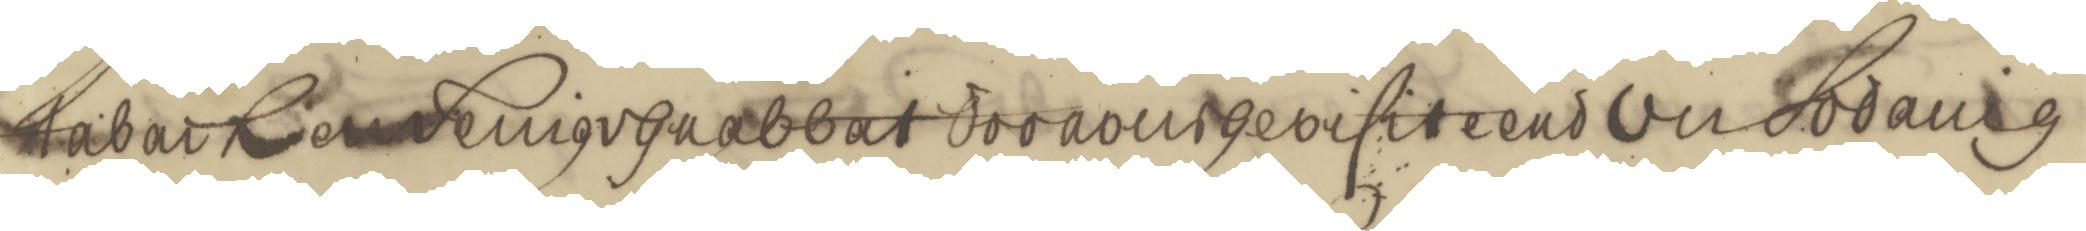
taback en Eenige grabbat doorons gevisiteerd en sodanig
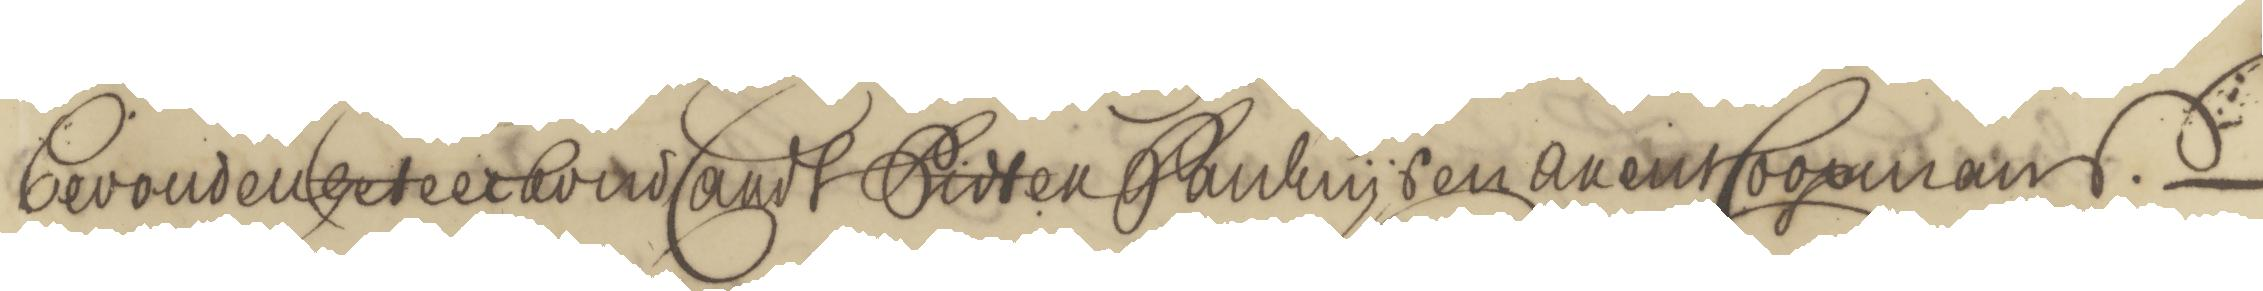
bevonden (geteeckend Carel Pieter Panhuijs en arentCoopmans
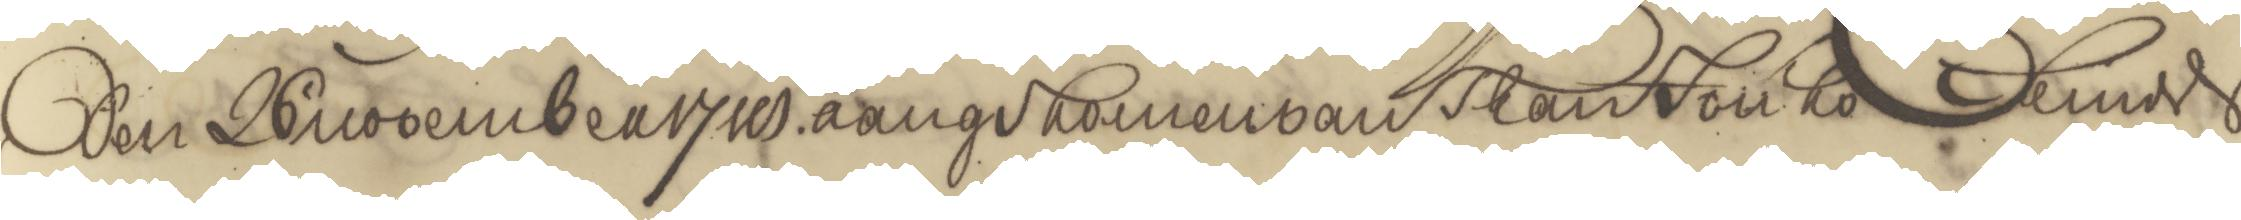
den 26 november 1718. aangekomen van Thansouko Chinees
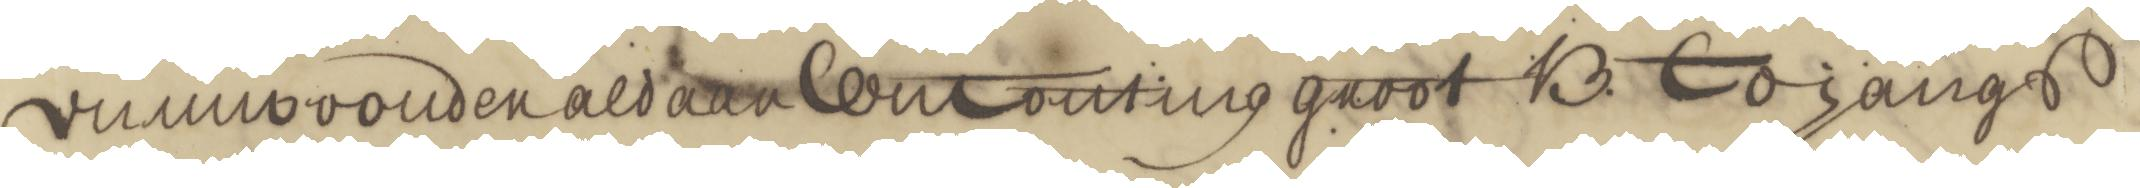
en inwoonder aldaar een conting groot 13. Coijangs
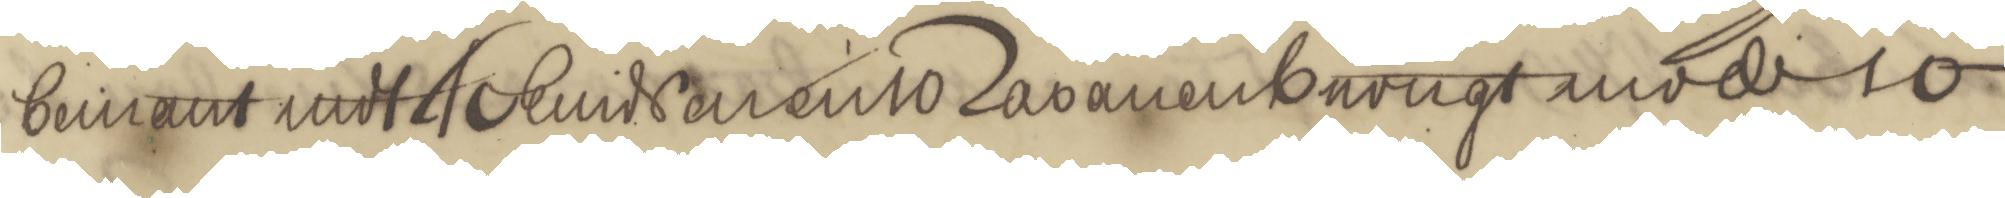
bemant met 4 chinesen en 10 Iavanen brengt mede 10
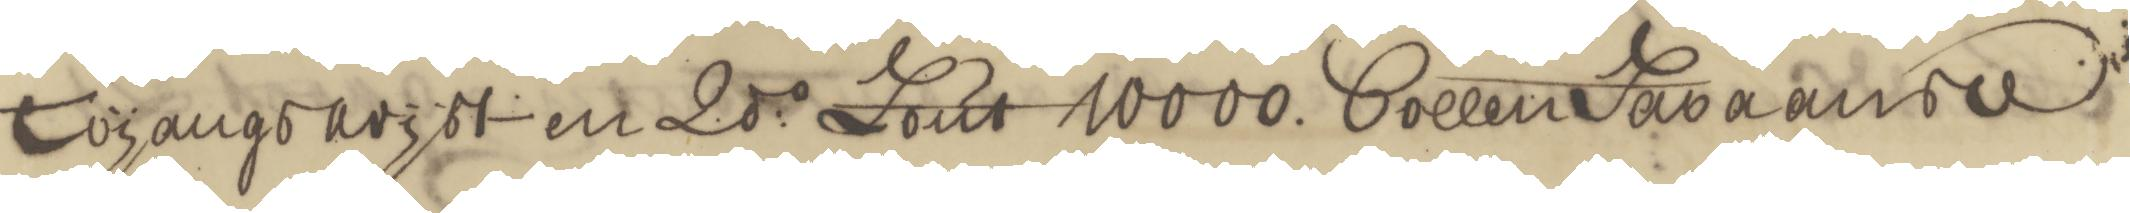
Coijangs reijst en 20:o Zout 10000. bollen Iavaanse
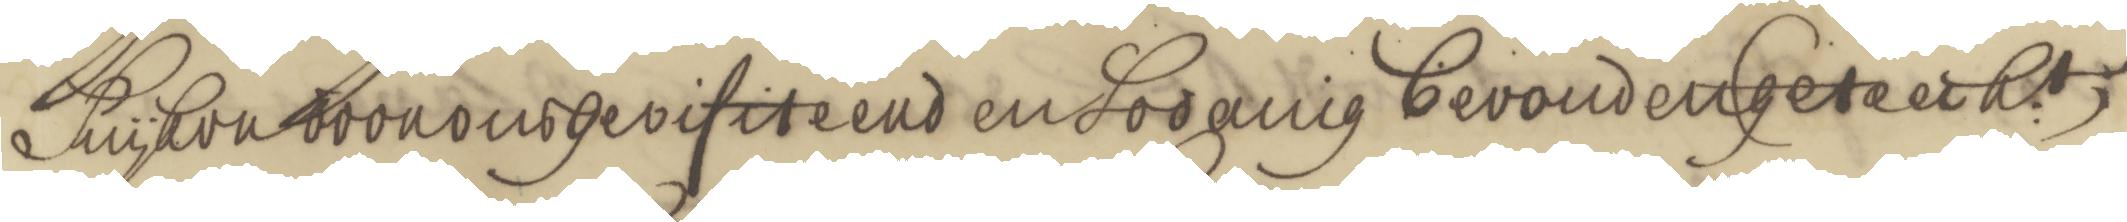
suijker door ons gevisiteerd en sodanig bevonden (geteeck:t)
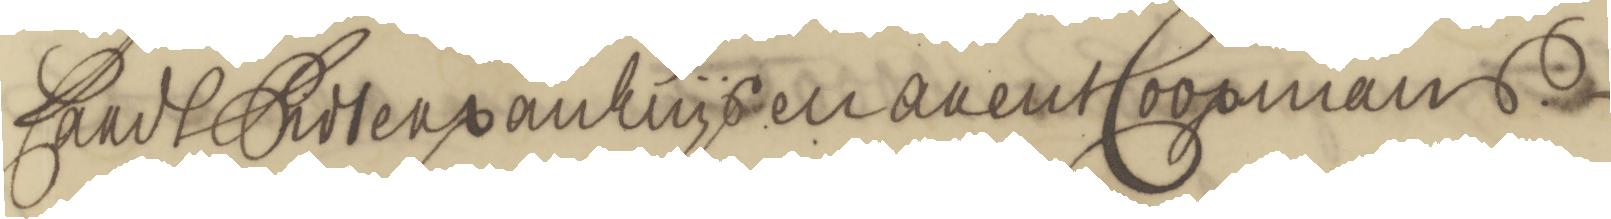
Carel Pieterpanhuijs en arentCoopmans
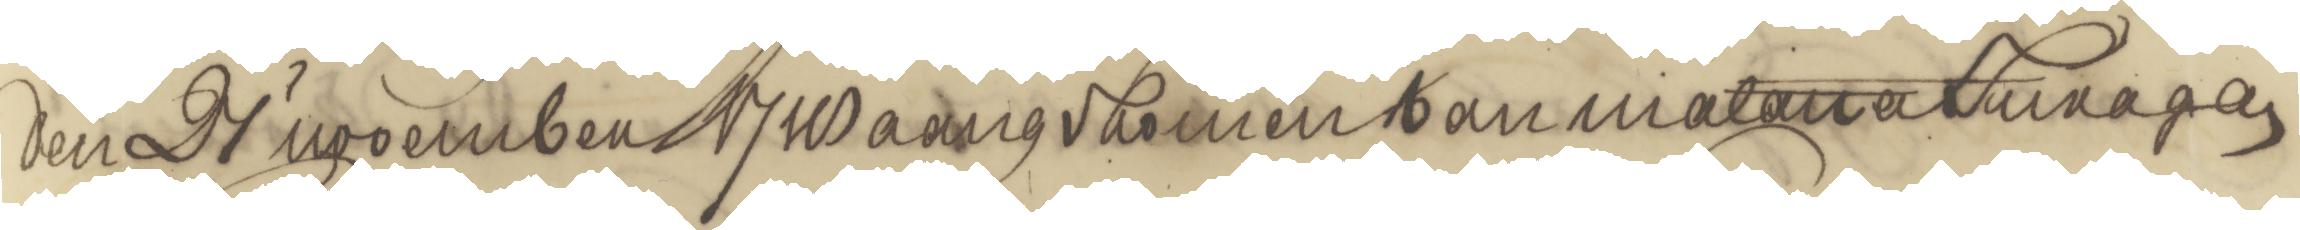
den 21' november 1718 aangekomen van malacca Furagan
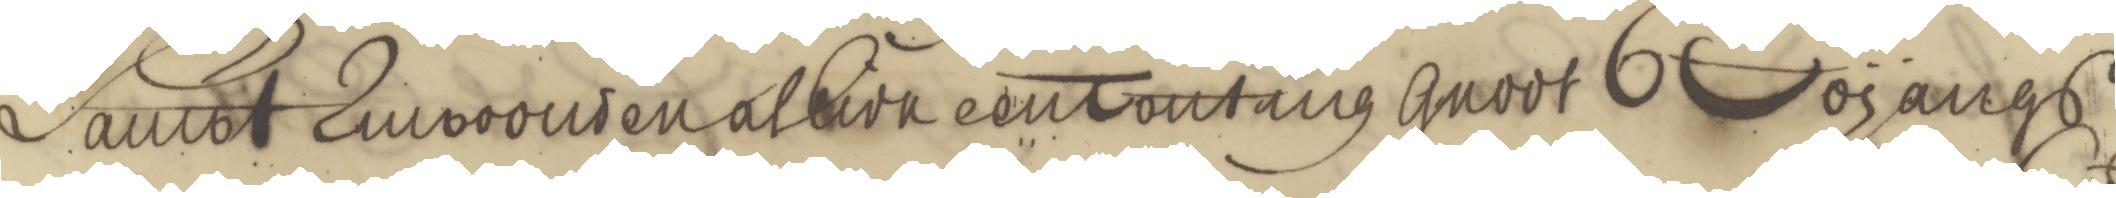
Samot Inwoonder alhier eenconting groot 6 Coijangs
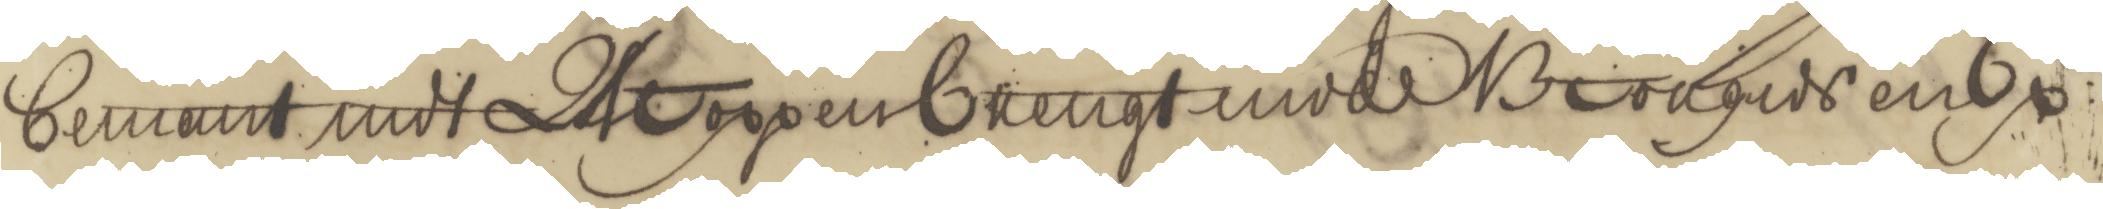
bemant met 24 Coppen brengt mede 13 corgies en 6 p:s
